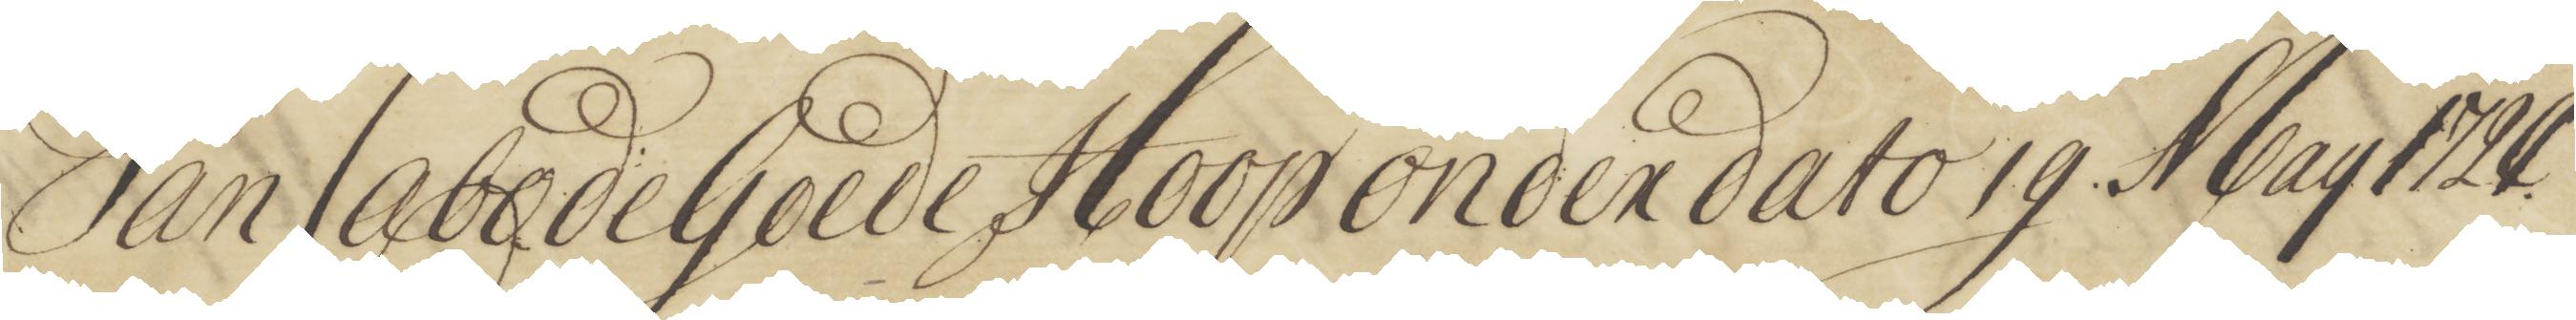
Van Cabo de Goede Hoop onder dato 19. May 1724.
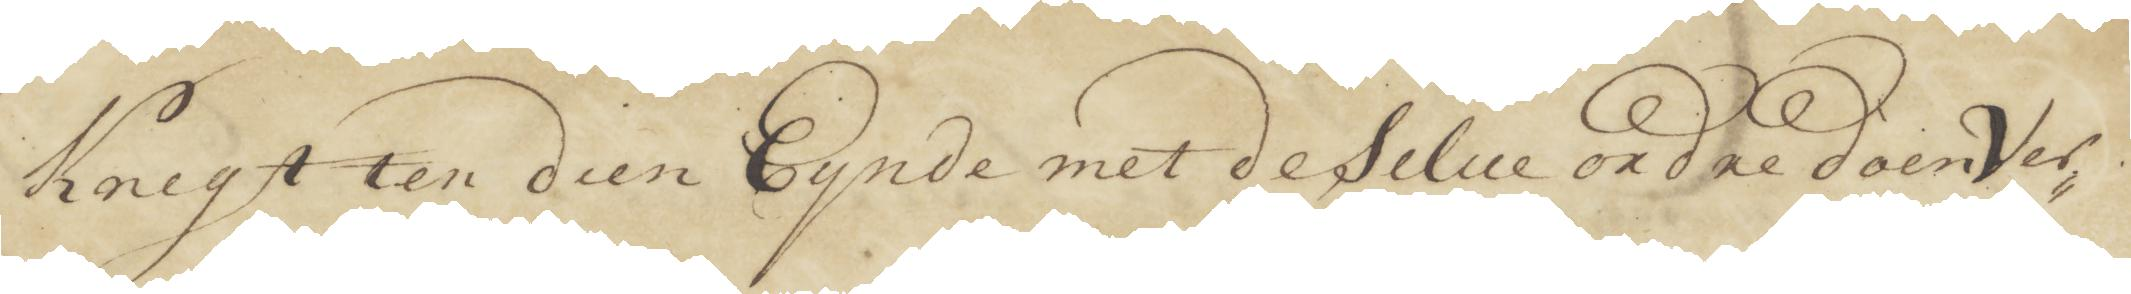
Knegt ten dien Eynde met deselve ordre doen ver„
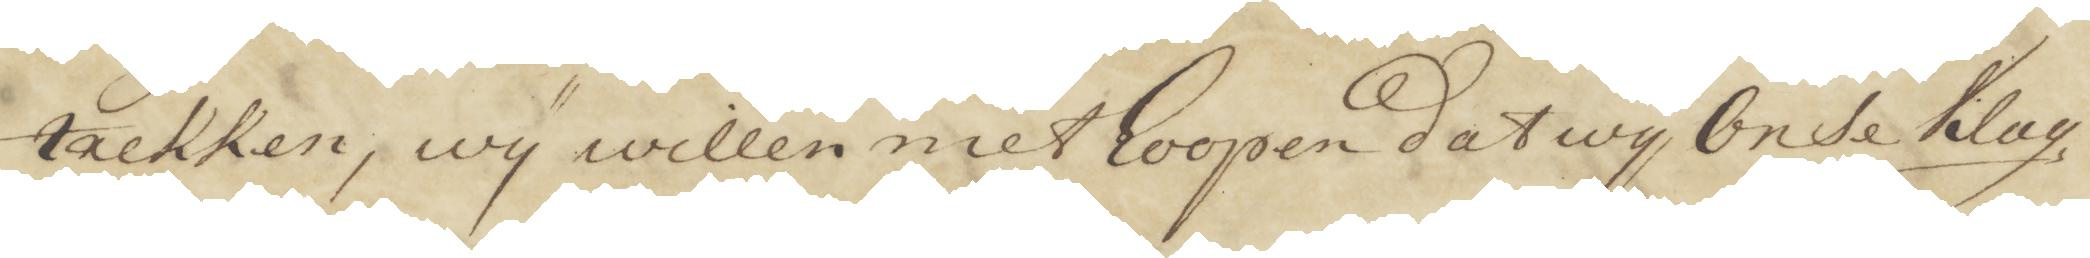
trekken, wij willen niet hoopen dat wij onse klag„
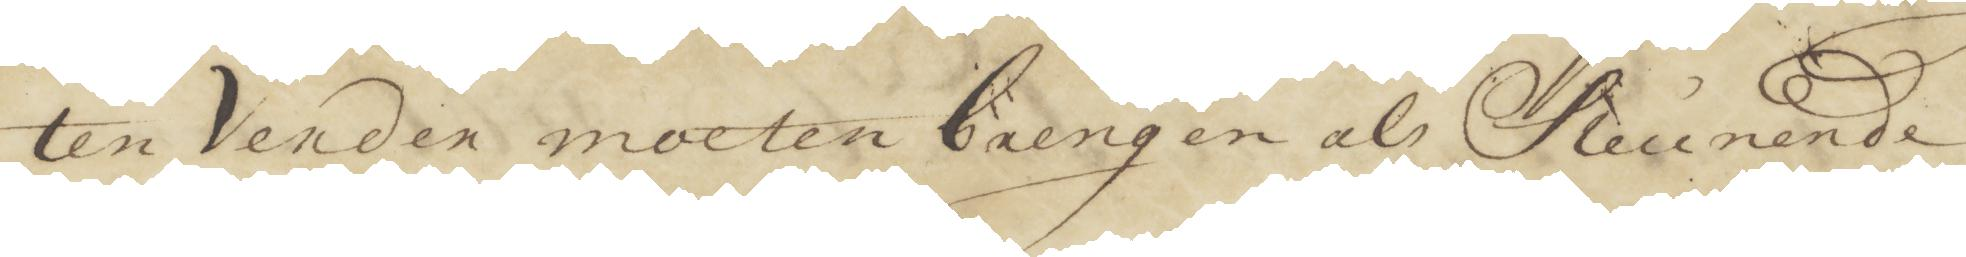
ten verder moeten brengen als Steunende
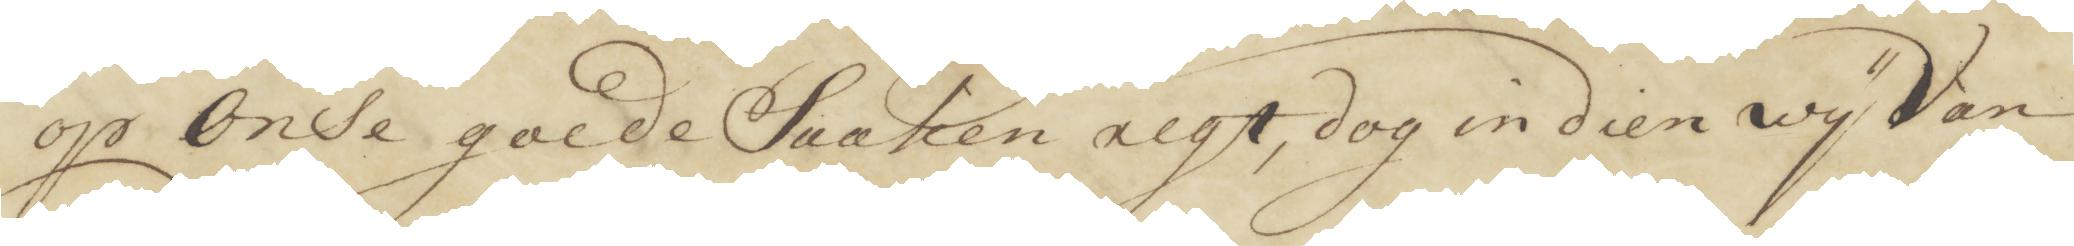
op onse goede saaken regt, dog in dien wij van
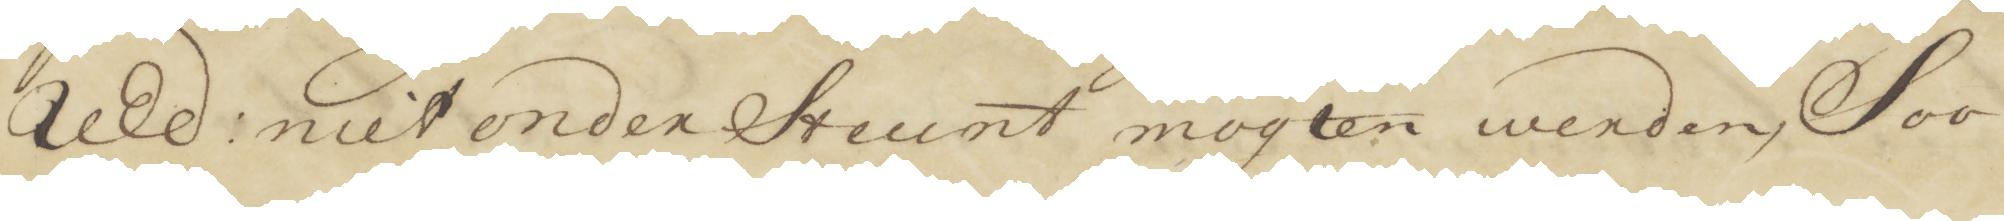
UEd: niet onder steunt mogten werden, soo
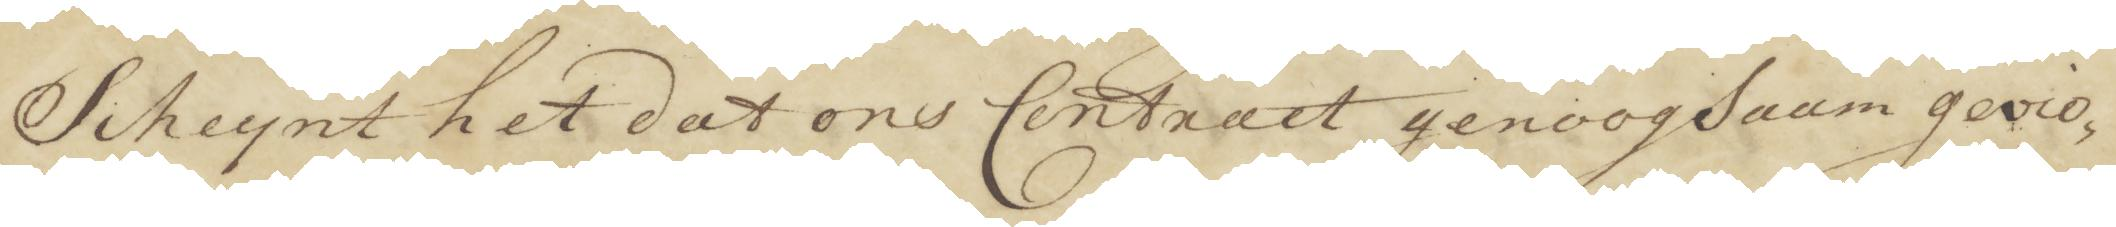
scheynt het dat ons Contract genoogsaam gevio„
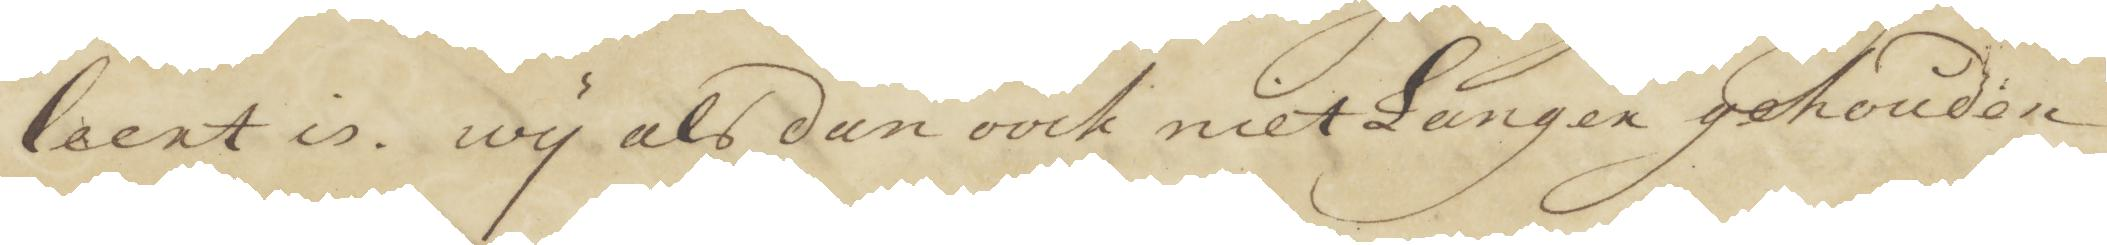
leert is. wij als dan oock niet Langer gehouden
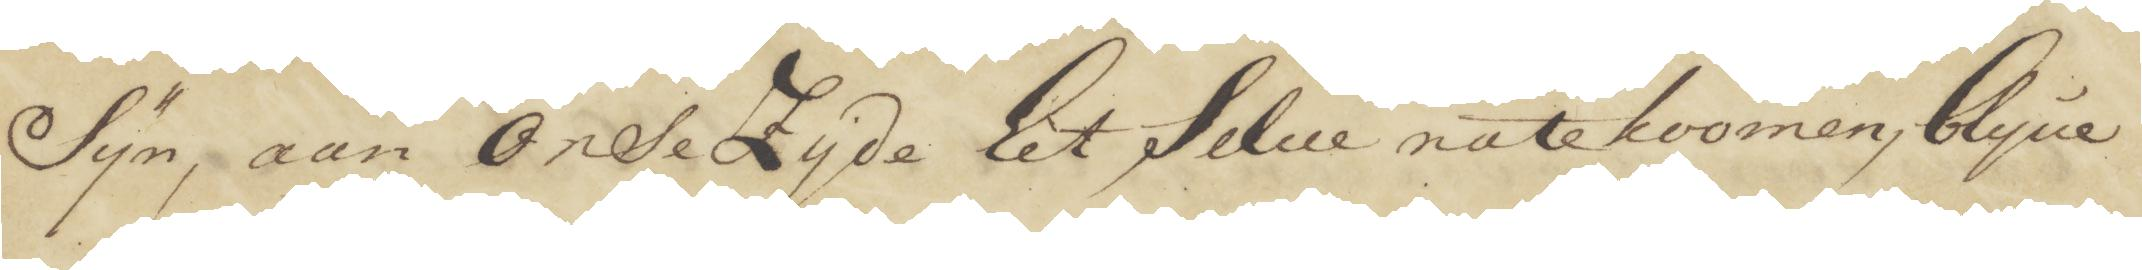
sijn, aan onse zijde het selve natekoomen, blijve
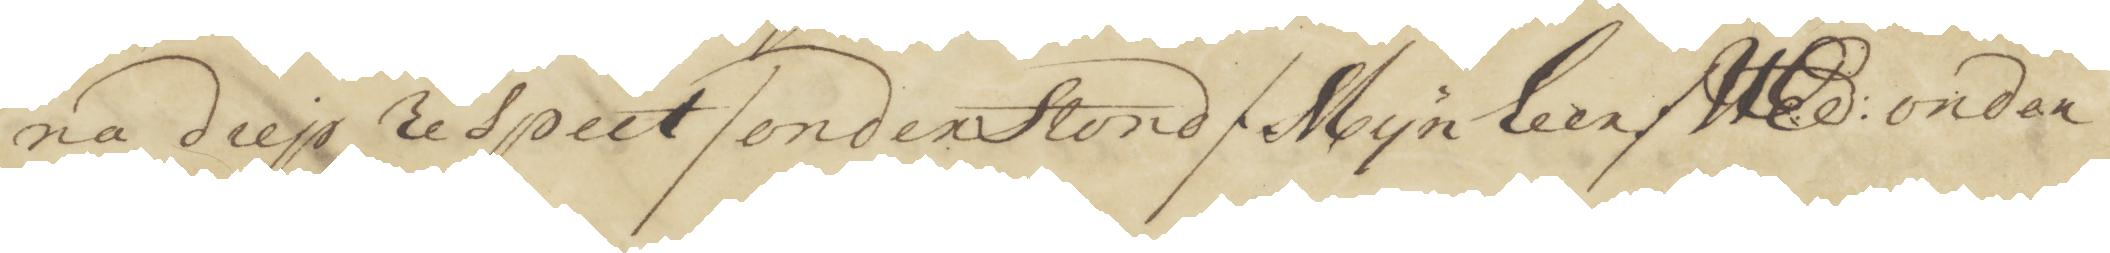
na diep respect / onderstond / Mijn heer / UEd: onder
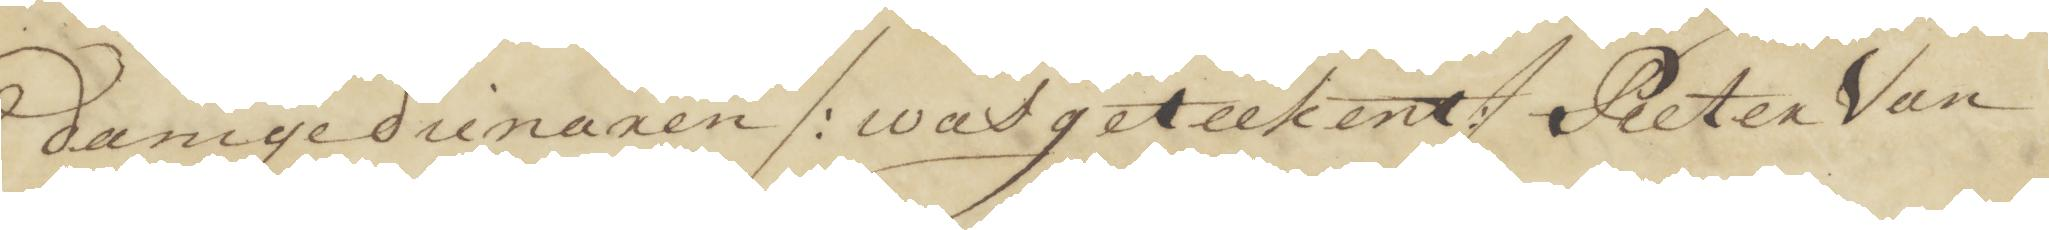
danige dienaren /: was geteekent :/ Pieter van
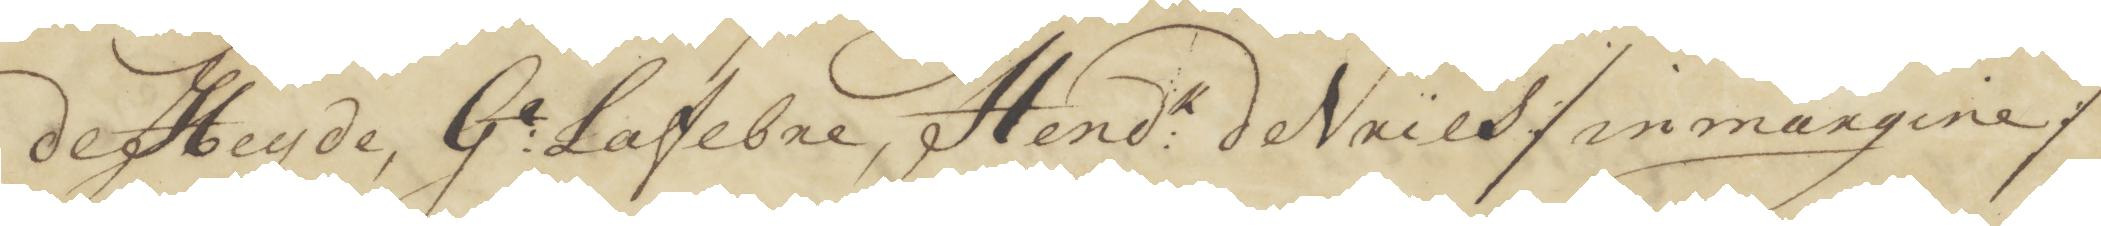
de Heyde, G:t Lafebre, Hend:k de Vries :/ in margine :/
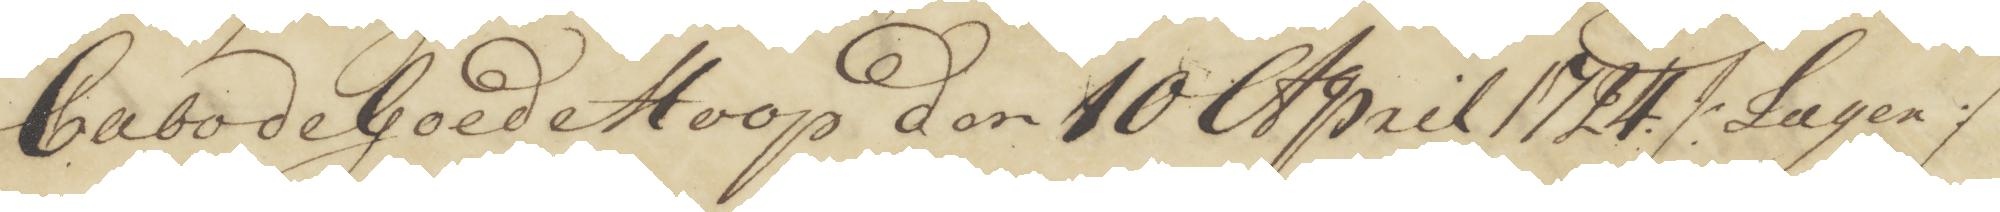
Cabo de Goede Hoop der 10 April 1724. /: Lager :/
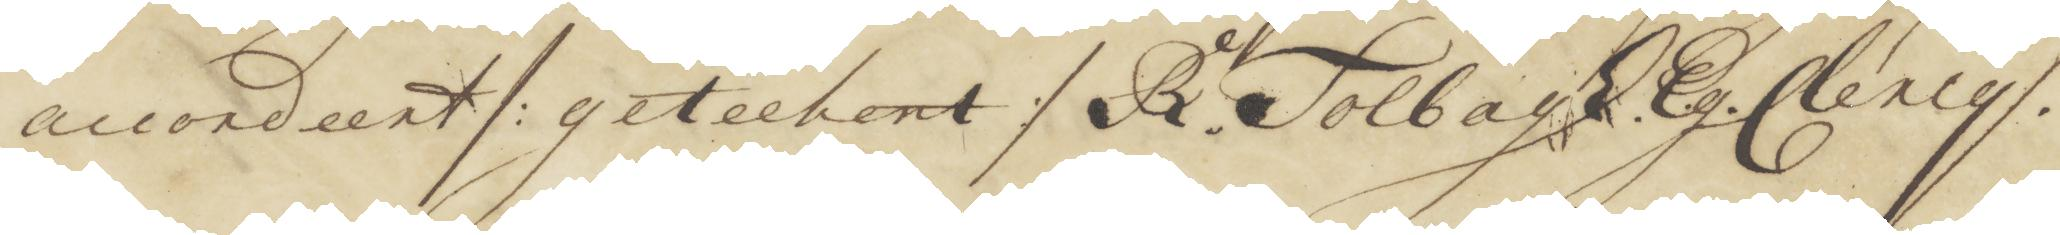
accordeert /: geteekent :/ R„e Tolbagh. E.g. Clercq.
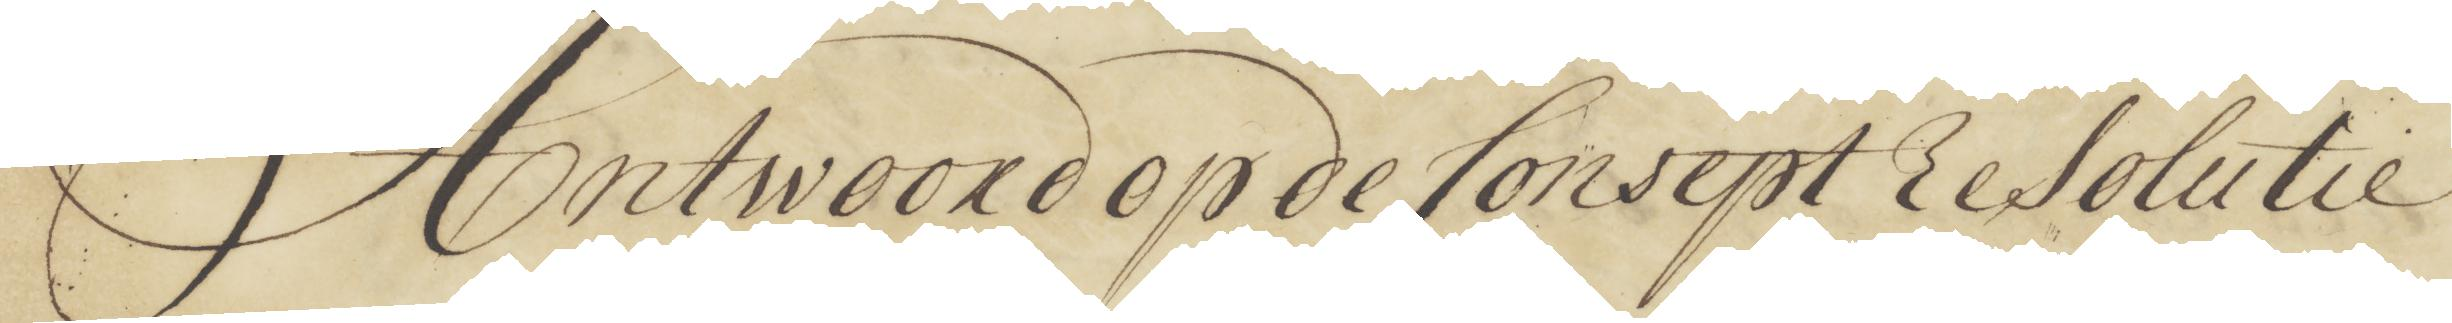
Antwoord op de Consept Resolutie
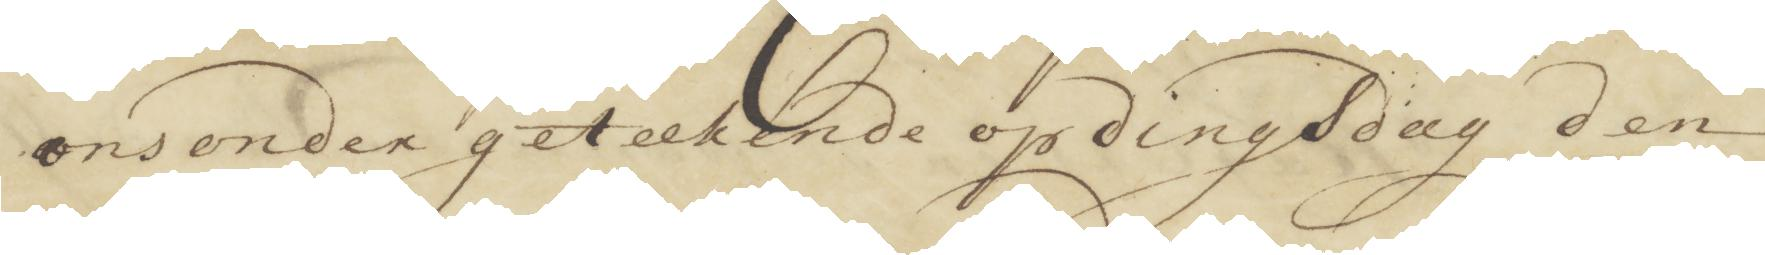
ons onder geteekende op dingsdag den
